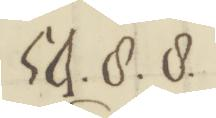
54.8.8.
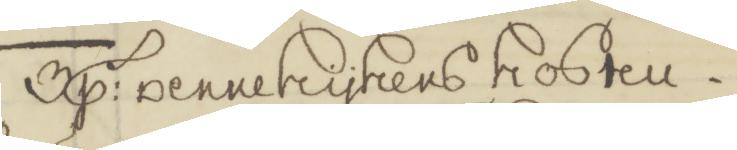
3p:s verrekijkers kosten .
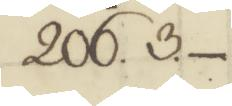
206. 3. —
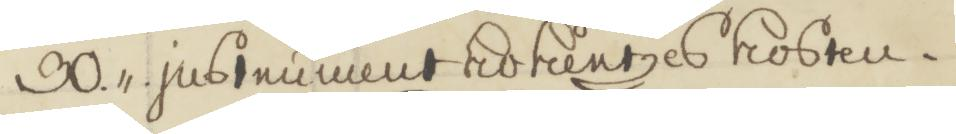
30.„ jnstrument kokertjes kosten .
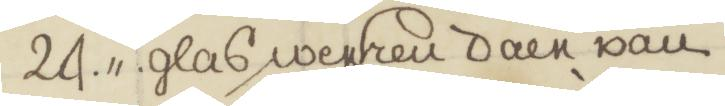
24. „ . glaswerken daer van
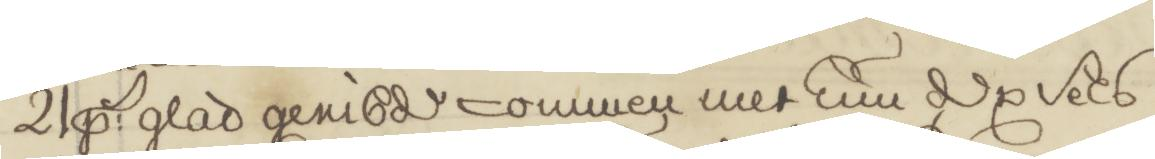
21 p:s glad geribde commen met hun dexsels
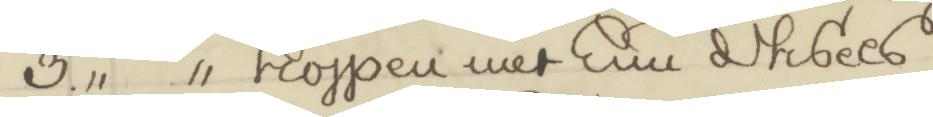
3. „ „ koppen met hun deksels
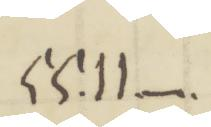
55.11.—.
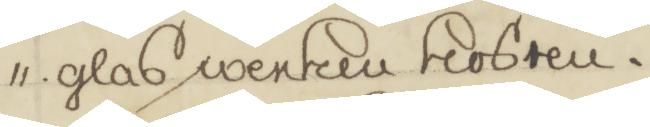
24 „ . glas werken kosten .
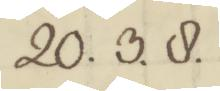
20.3.8.
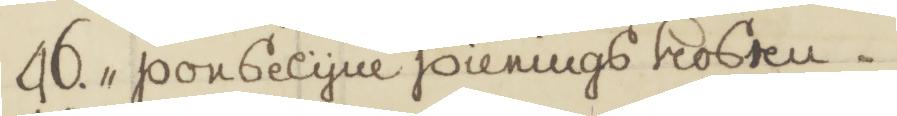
40. „ porselijne pierings kosten -
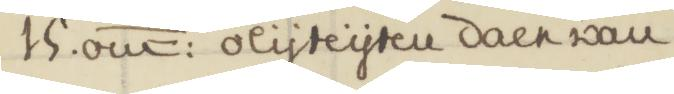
15. onc: olijteijten daer van
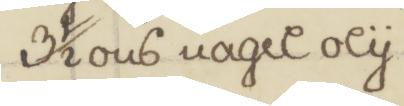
3½ ons nagel olij
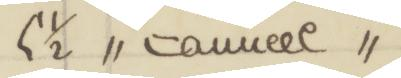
5½ „ canneel „
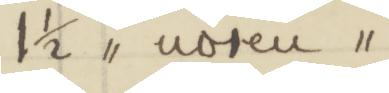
1½ „ noten „
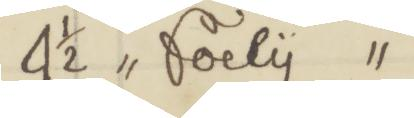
4½ „ foelij „
